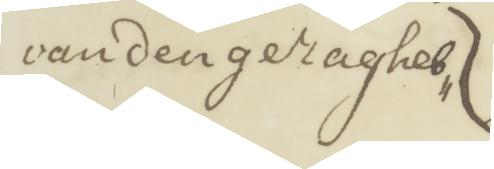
van den gezagheb„
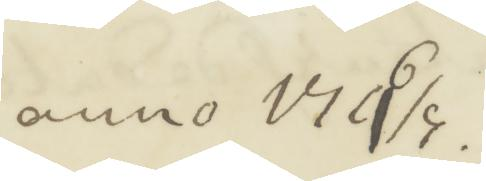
anno 1746/7.
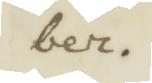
ber.
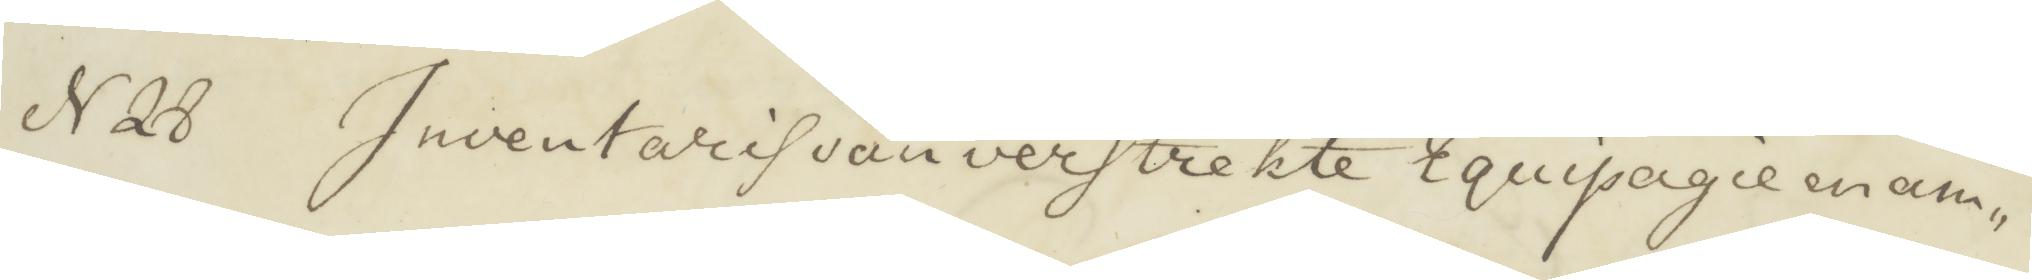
N28 Jnventaris van verstrekte Equipagie en am„
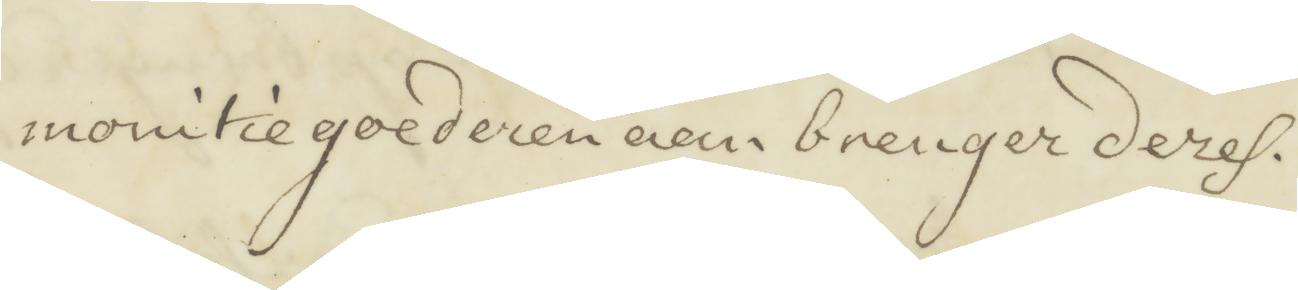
monitie goederen aan brenger dezes.
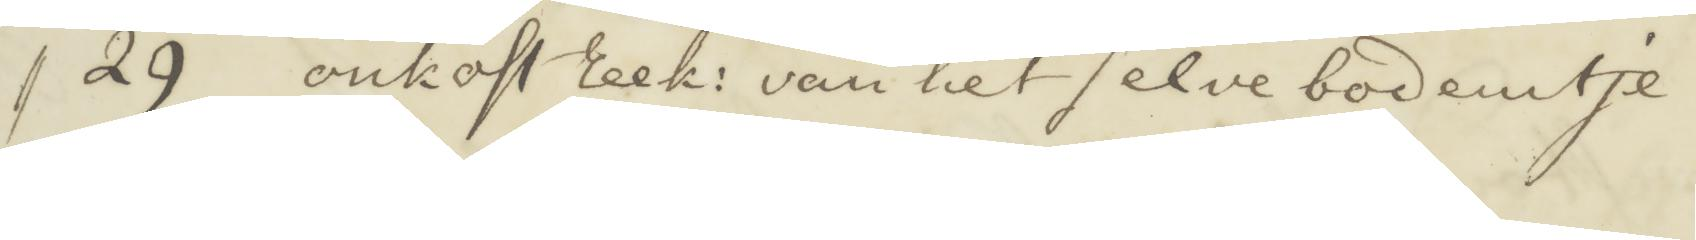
„ 29 onkost reek: van het selve bodemtje
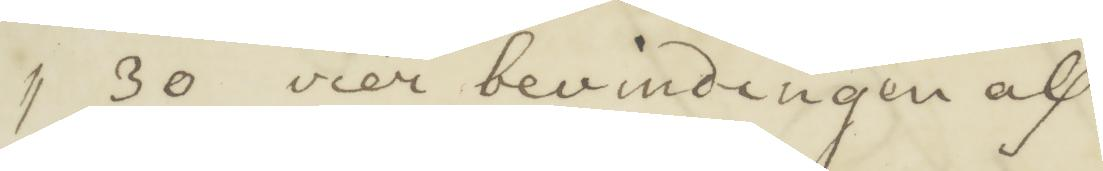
„ 30 vier bevindingen als
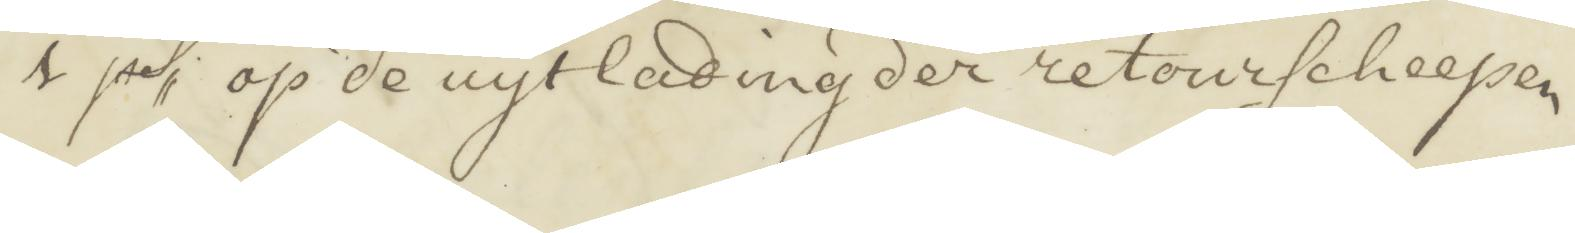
1 p„s op de uijtlading der retourscheepen
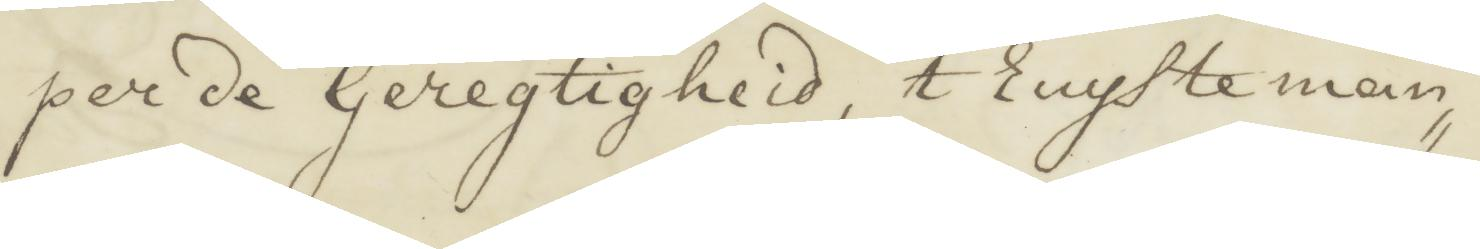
per de geregtigheid, t huys te man„
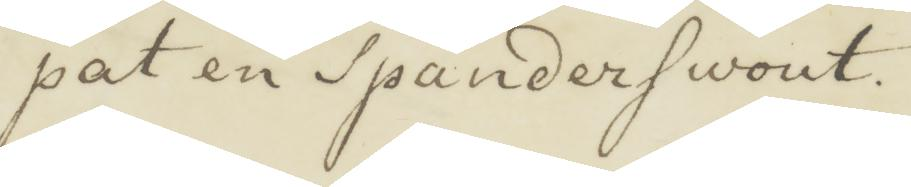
pat en spanderswout.
